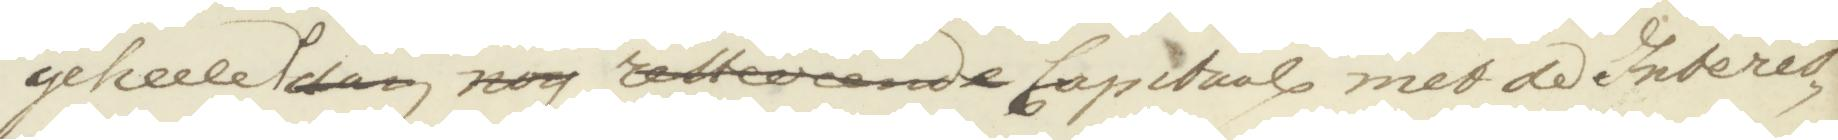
geheele dan nog resteerende Capitaal met de Interes„
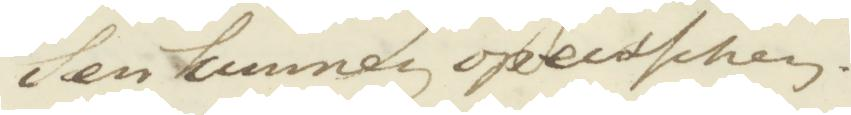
sen kunnen opeisschen
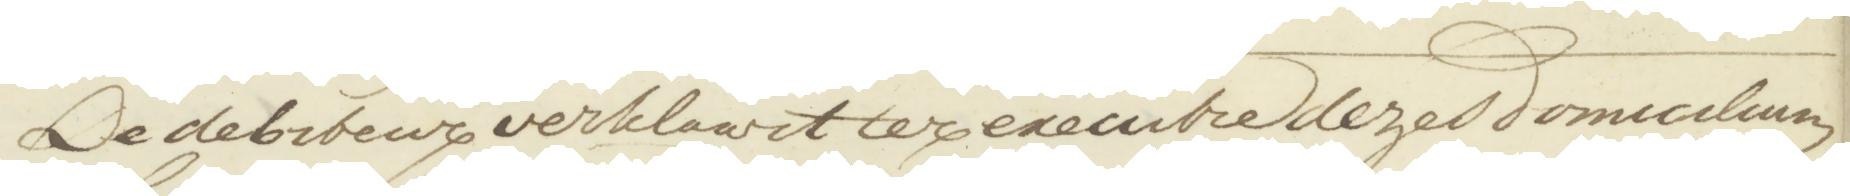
De debiteur verklaart ter executie dezes domicilium
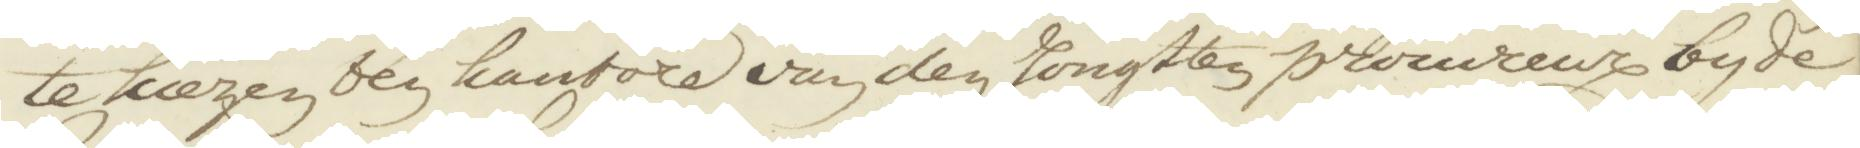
te kiezen ten kantore van den Jongsten procureur by de
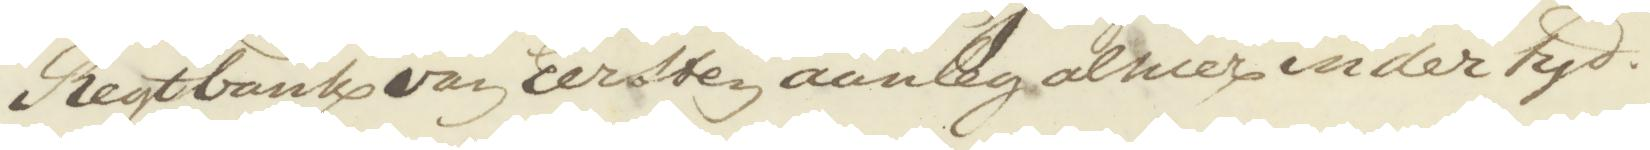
Regtbank van Eersten aanleg alhier in der tyd.
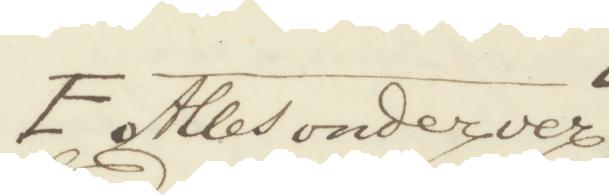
E Alles onder ver
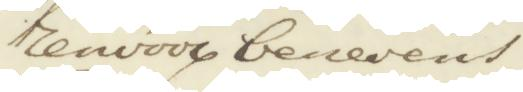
renvooi benevens
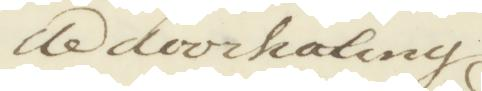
de doorhaling,
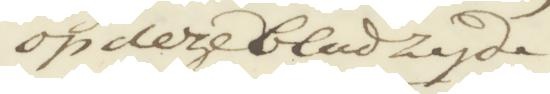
op deze bladzyde
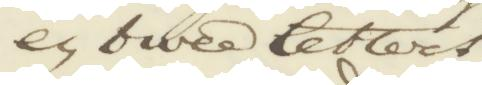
en twee letters
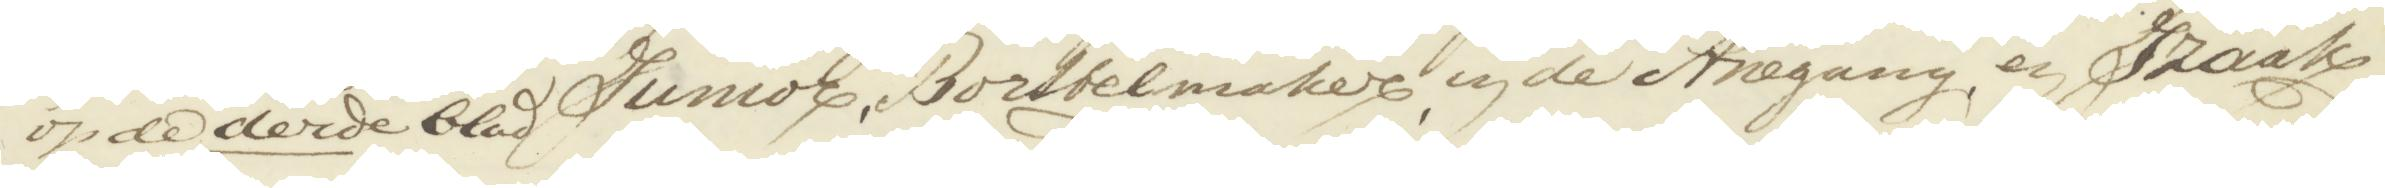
op de derde blad Iunior, Borstelmaker, in de Anegang en Izaak
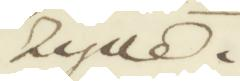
zyde.
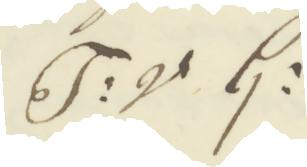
T: V G.
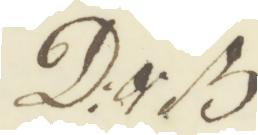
D: v B
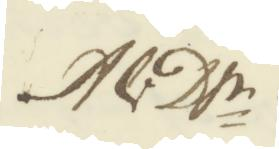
A V Dj=r
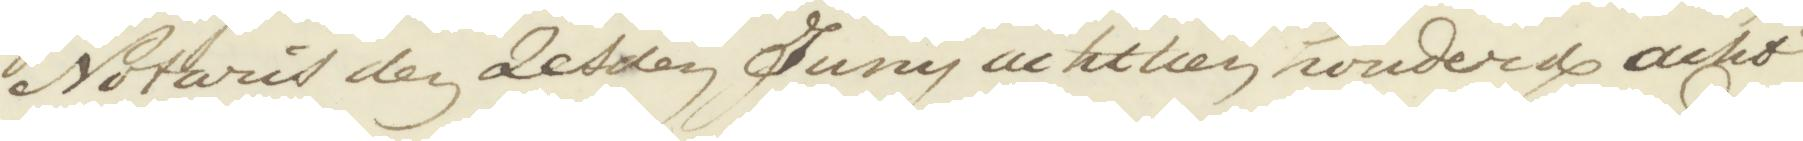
Notaris den Zesden Iuny achttien honderd acht
